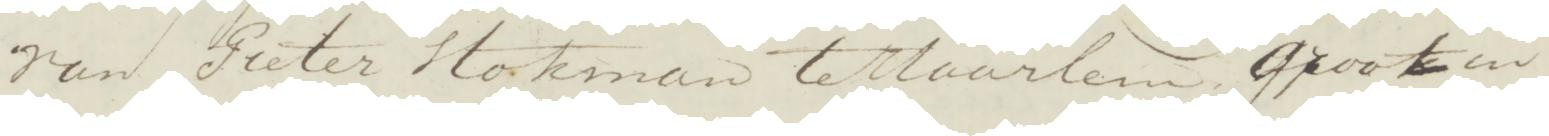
van Pieter stokman te Haarlem, Groot en
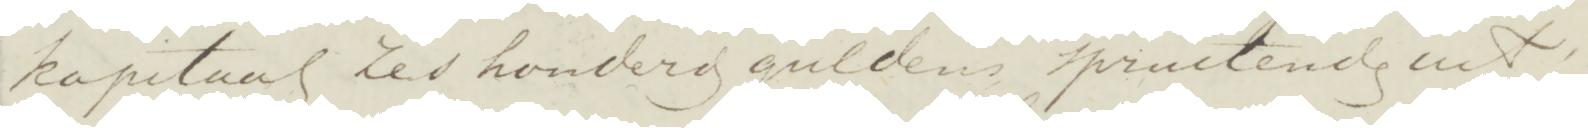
kapitaal Zes honderd guldens spruitende uit.
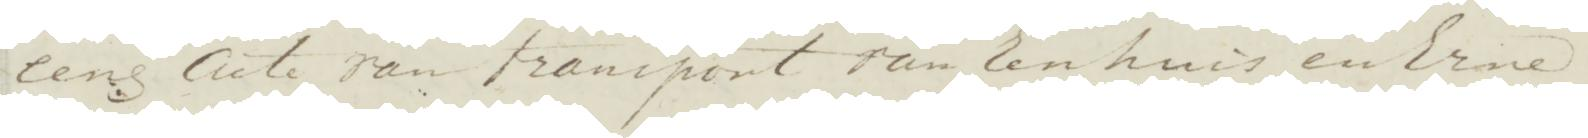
eene Acte van transport van Een huis en Erve
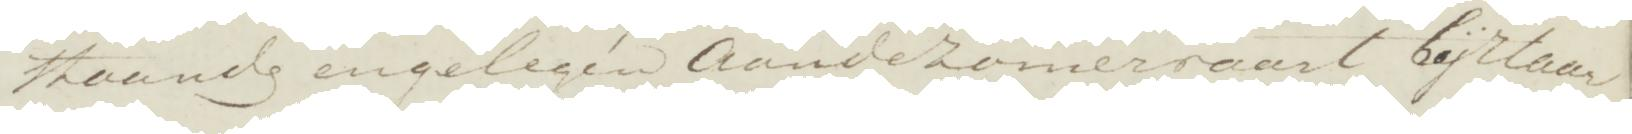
staande en gelegen Aan de zomervaart bij Haar
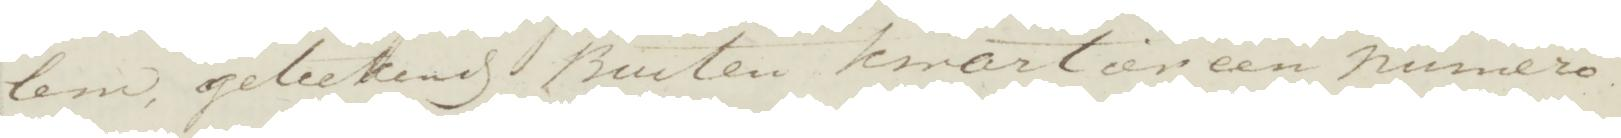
lem, geteekend Buiten kwartier een numero
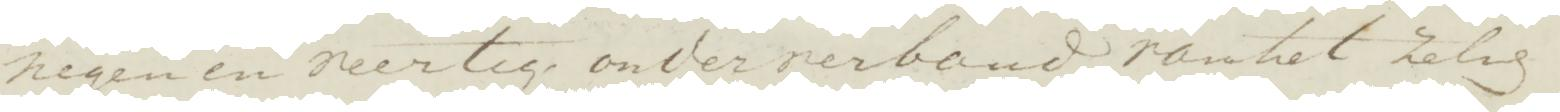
negen en veertig, onder verband van het zelve
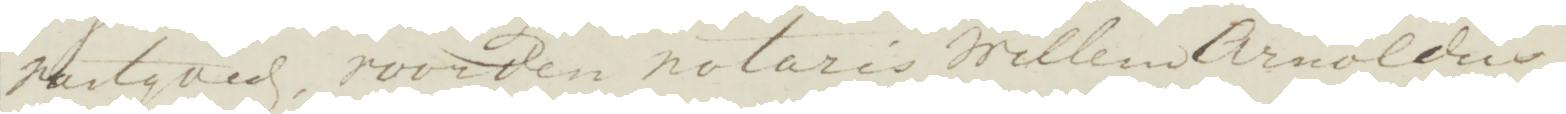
vastgoed, voor den notaris Willem Arnoldus
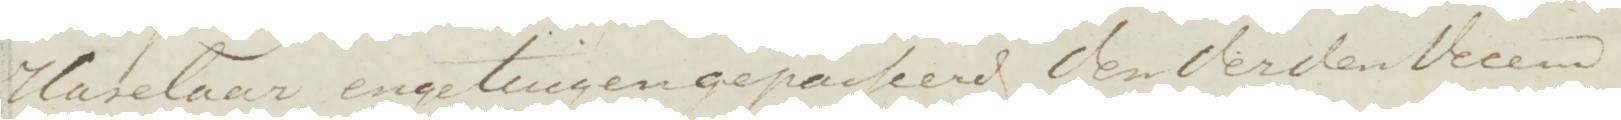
Haselaar en getuigen gepasseerd den derden Decem
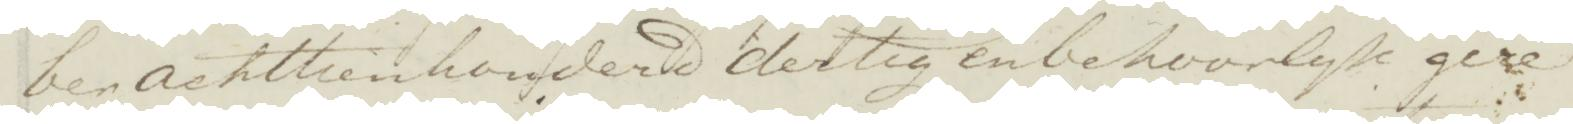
ber achttienhonderd dertig en behoorlyk gere
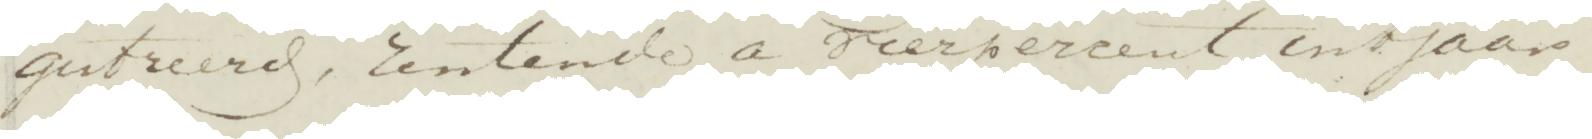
gistreerd, rentende a vier percent in't jaar
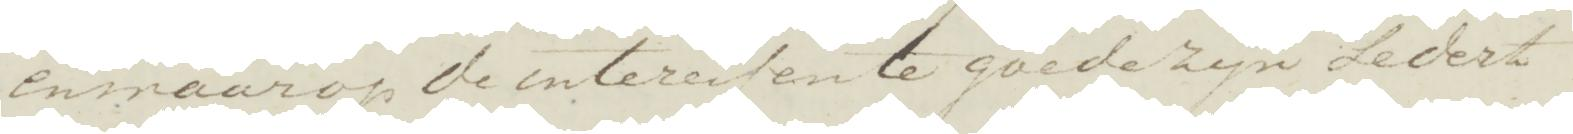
en waarop de interessen te goede zijn sedert,
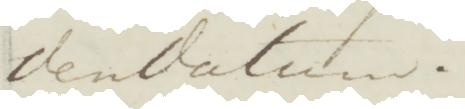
den datum.
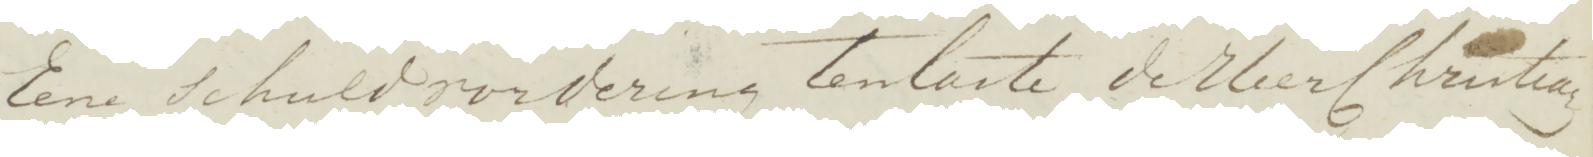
Eene schuld vordering ten laste de Heer Christian
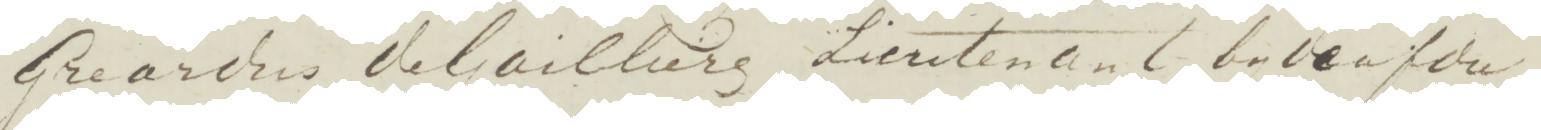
Greardus de Gaillieren Lieutenant by de afdee
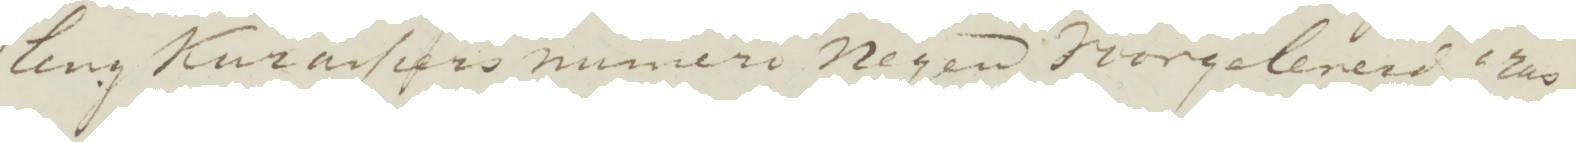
ling Kurassiers numero Negen voorgeleverd gras
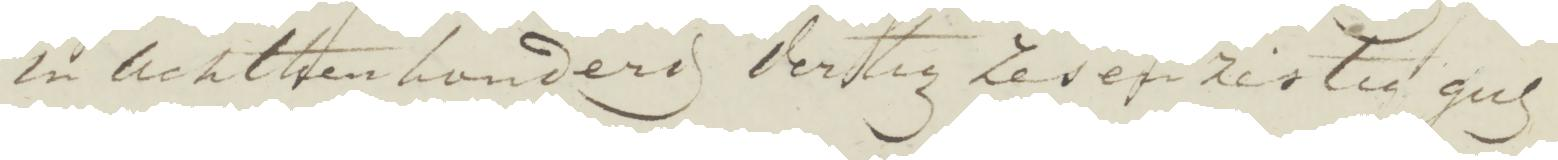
in achttienhonderd dertig zes en zestig gul
